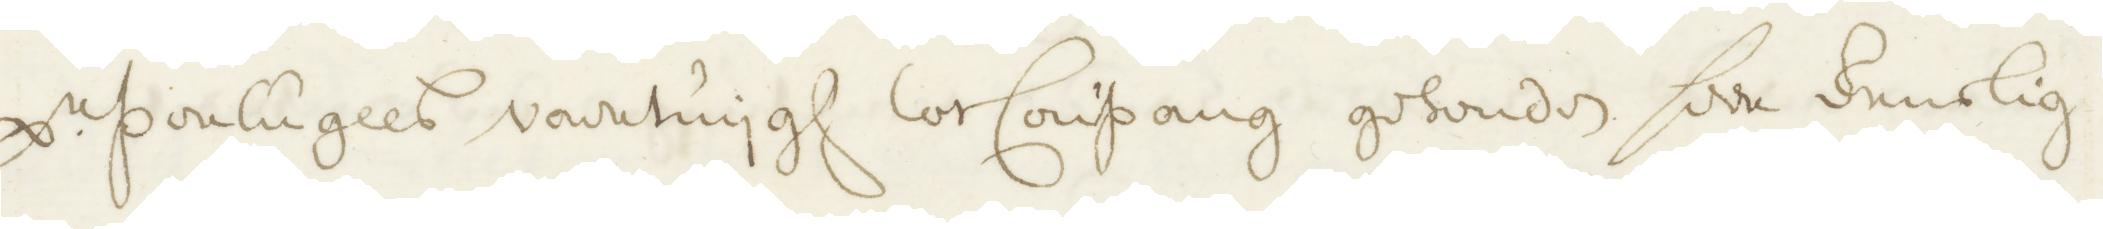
p:r portugees vaertuijgh totCoupang gesenden seer Ernstig
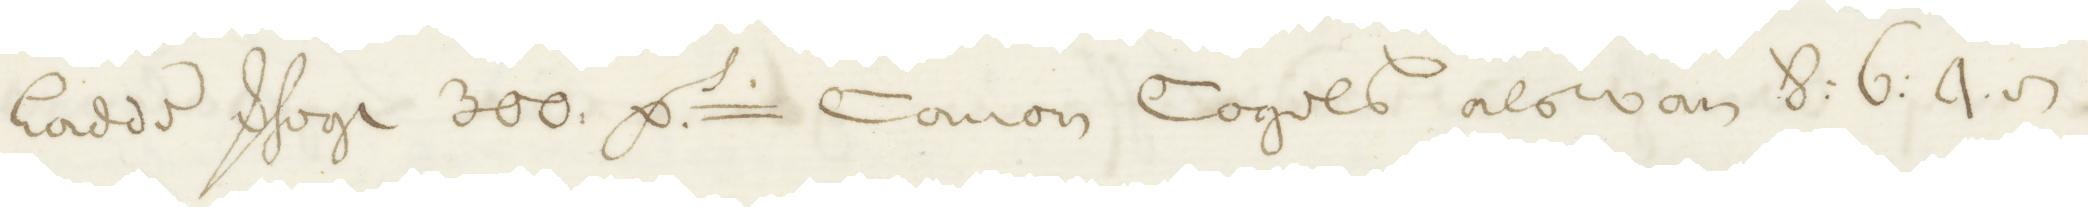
hadde versogt 300. p=s Canon Cogels alsvan 8:6: 4.en
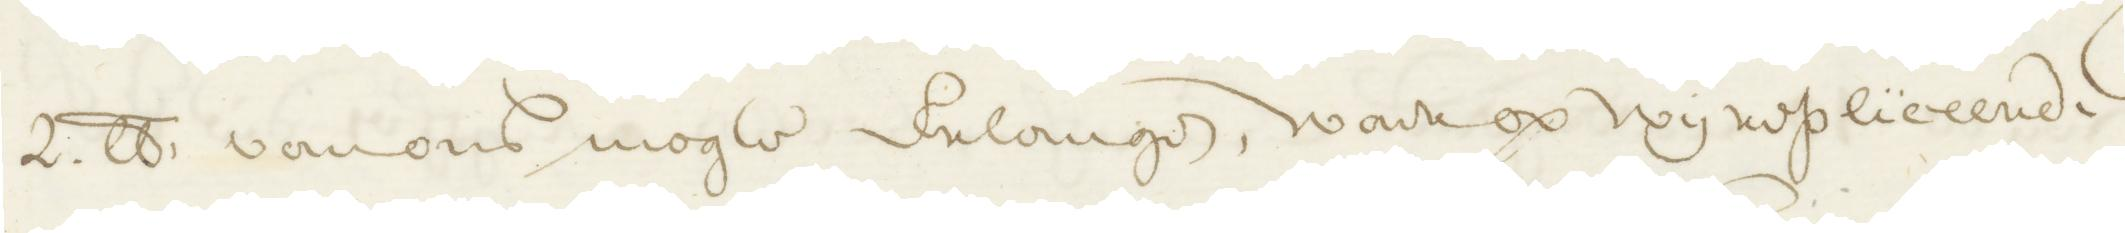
2. lb: vanons mogte Erlangen, waer op wij repliceerde
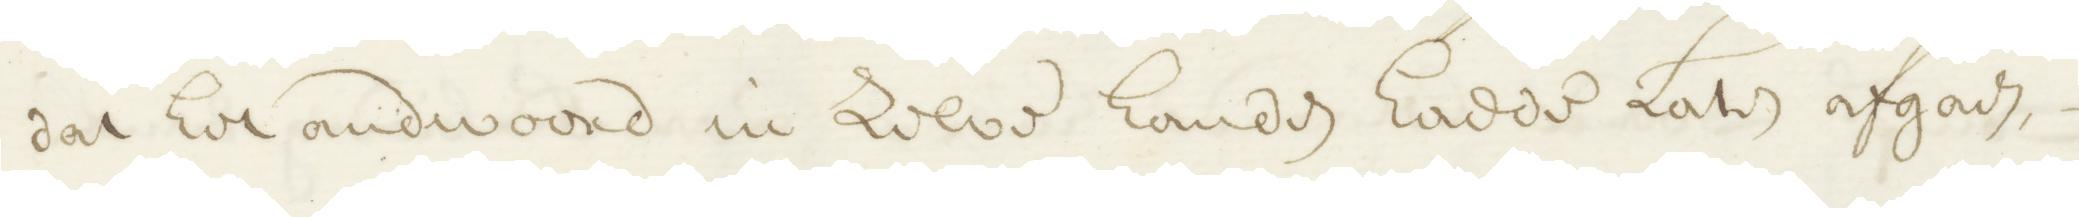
dat het andwoord in zelve handen hadde Laten afgaen,
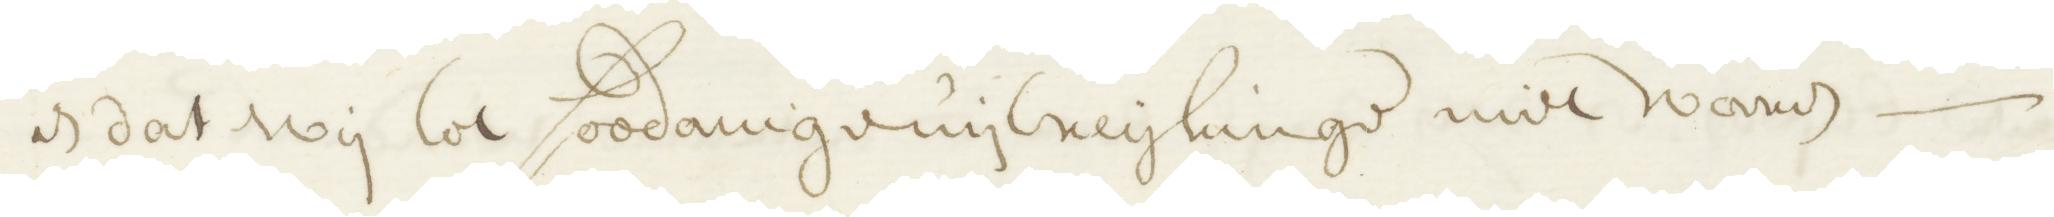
is dat wij tot soodanige uijtreijkinge niet waren—
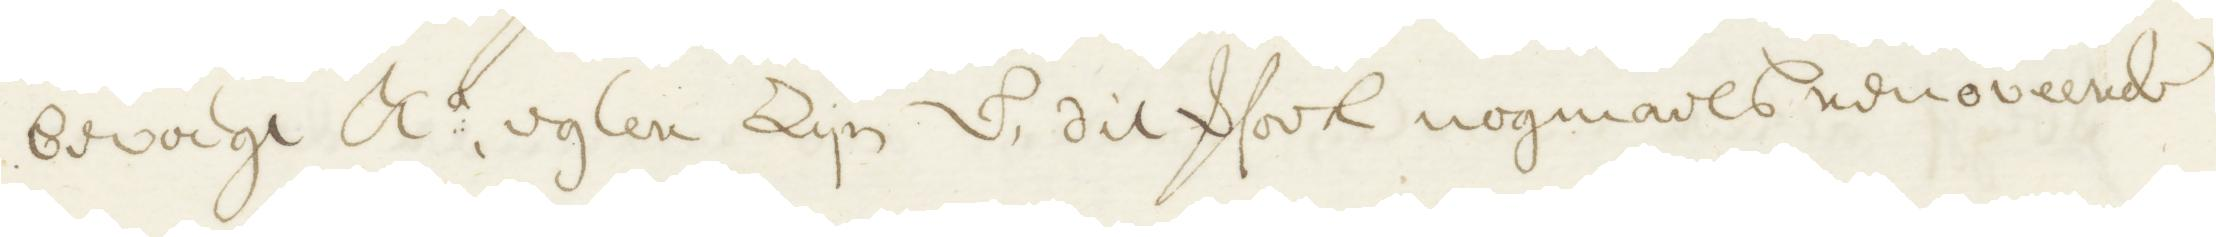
bevoegt &:a, egter zijn E. dit versoek nogmaels renoveerde
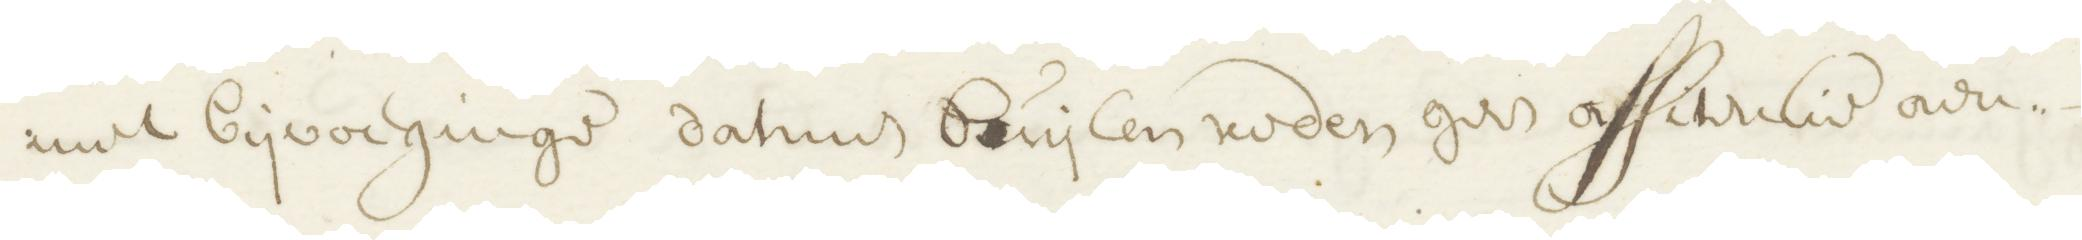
met bijvoeginge datmen buijten reden geen assitentie aen„
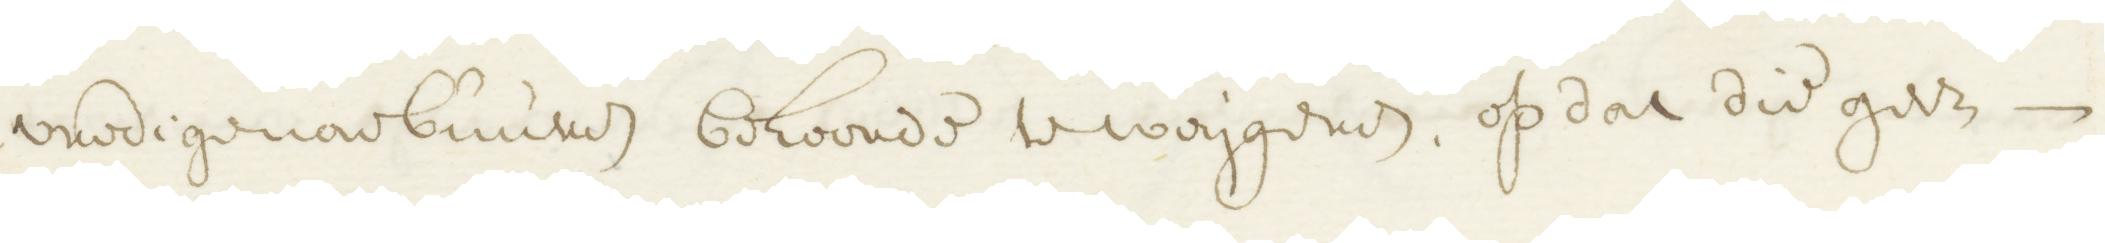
vredigenaebuuren behoorde teweijgeren, op dat die geen —
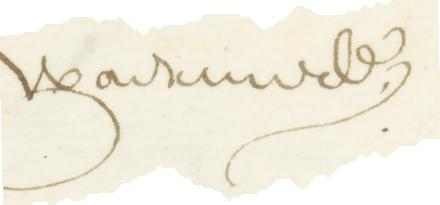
waermede./.
